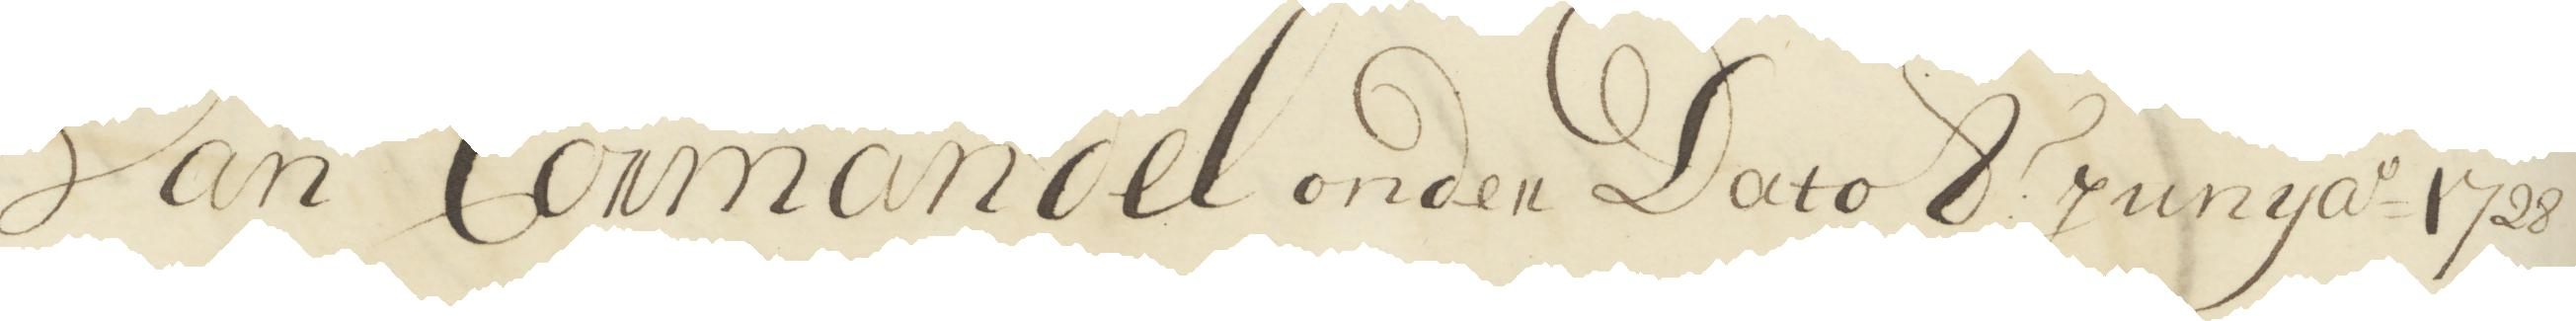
Van Cormandel onder Dato 8:' Junij a=o 1728
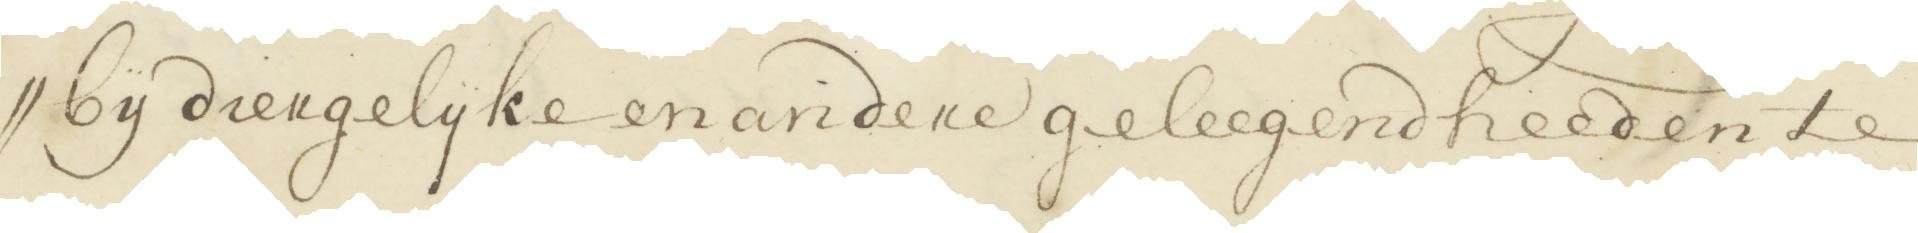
„ bij diergelijke en andere geleegendheeden te
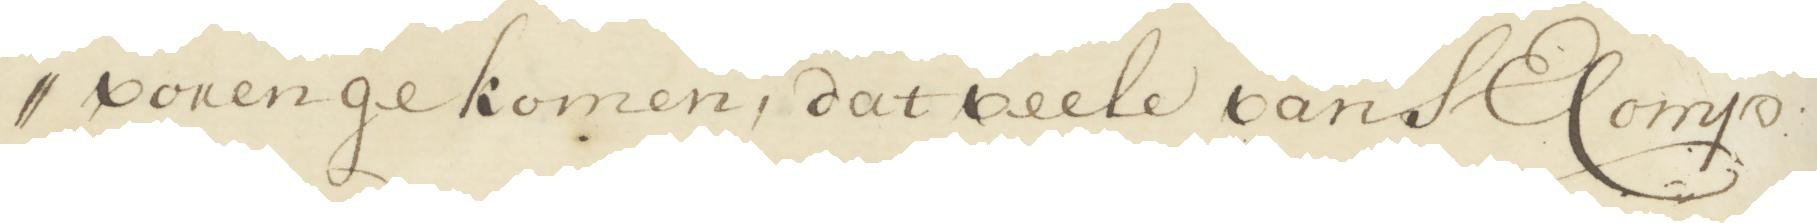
„ voren gekomen, dat veele van 'S EComp:s
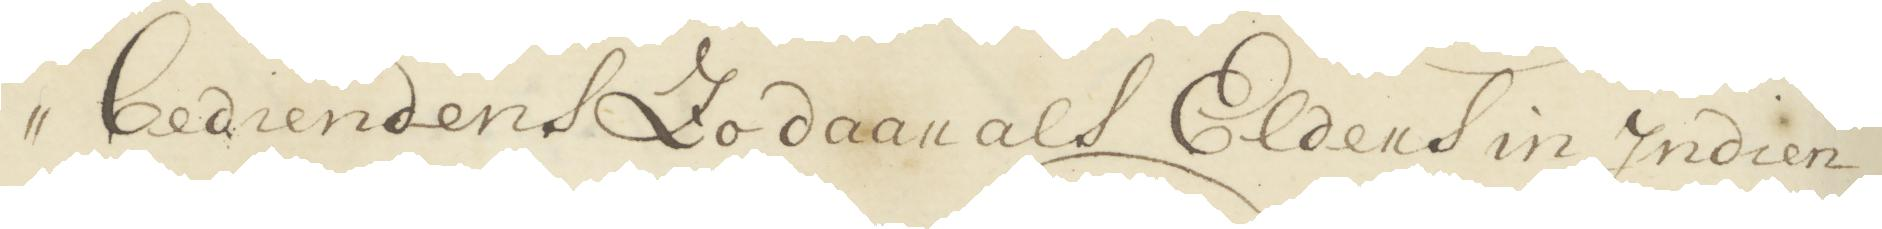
„ bediendens Zo daar als Elders in Jndien
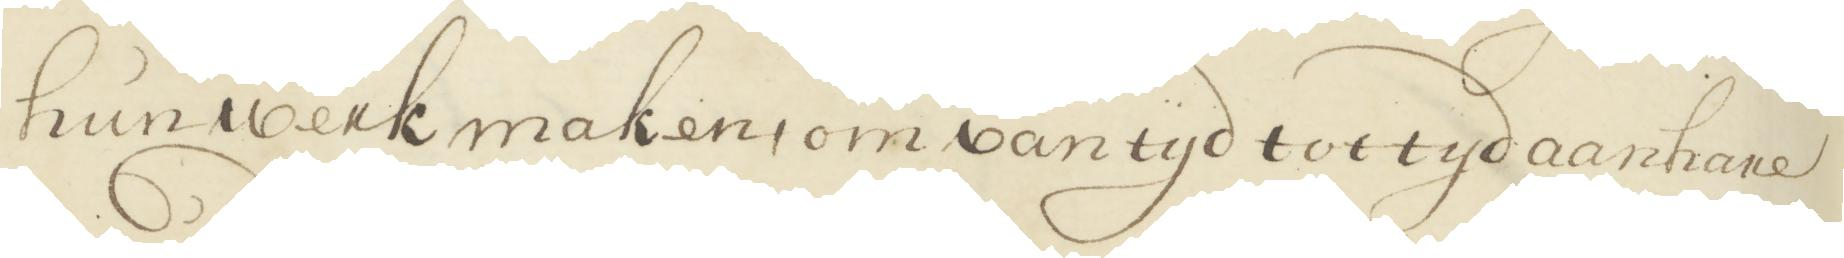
hun werk maken, om van tijd tot tyd aanhare
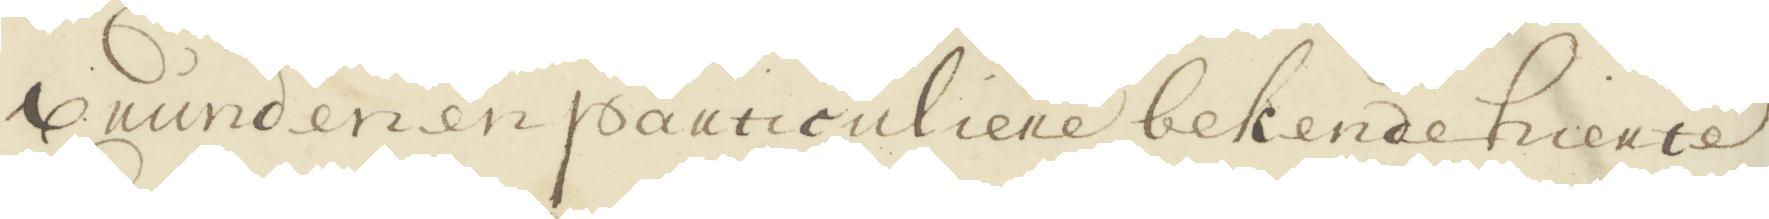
vrunden en particuliere bekende hier te
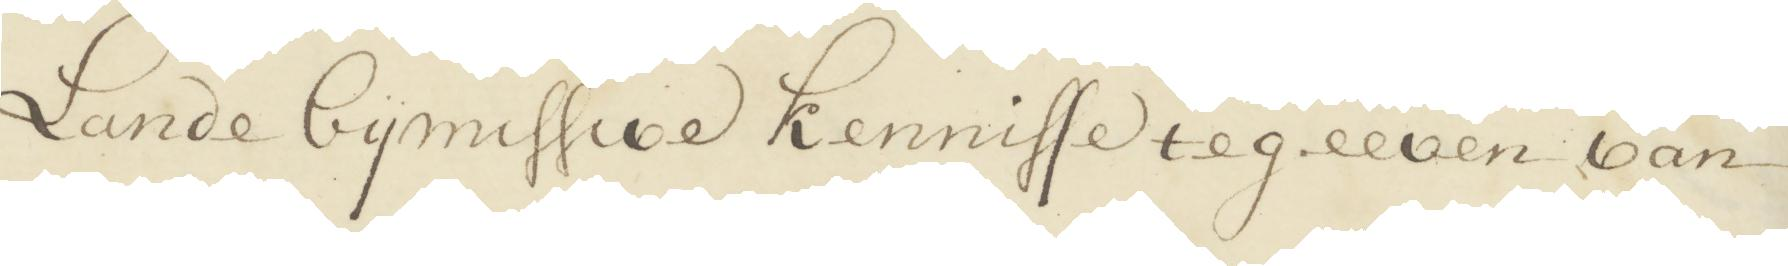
Lande bij missive kennisse te geeven van
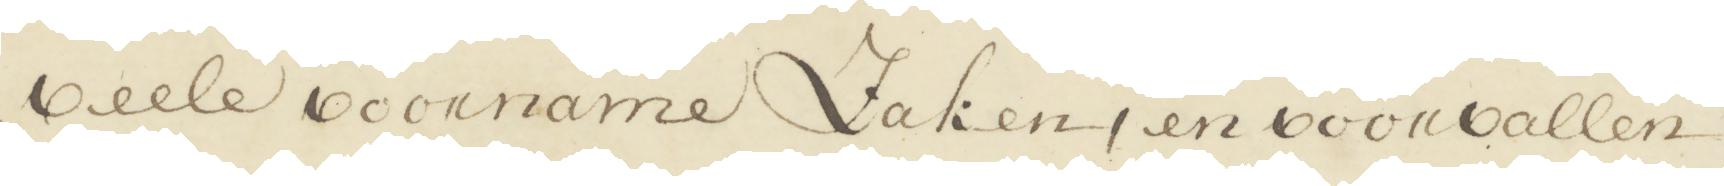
veele voorname Zaken, en voorvallen
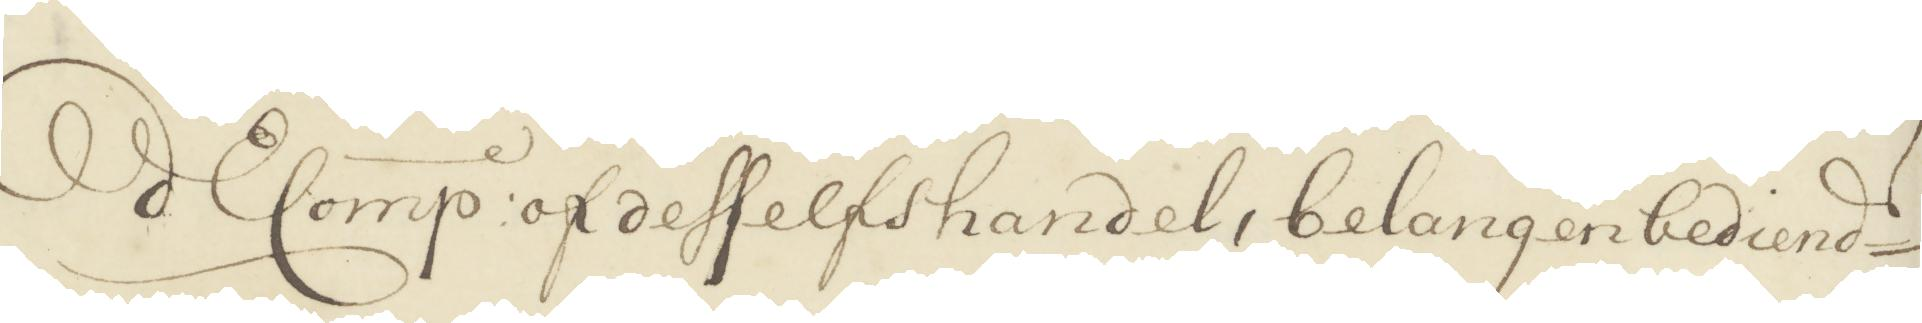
d E Comp:e of desselfs handel, belangen bediend=s
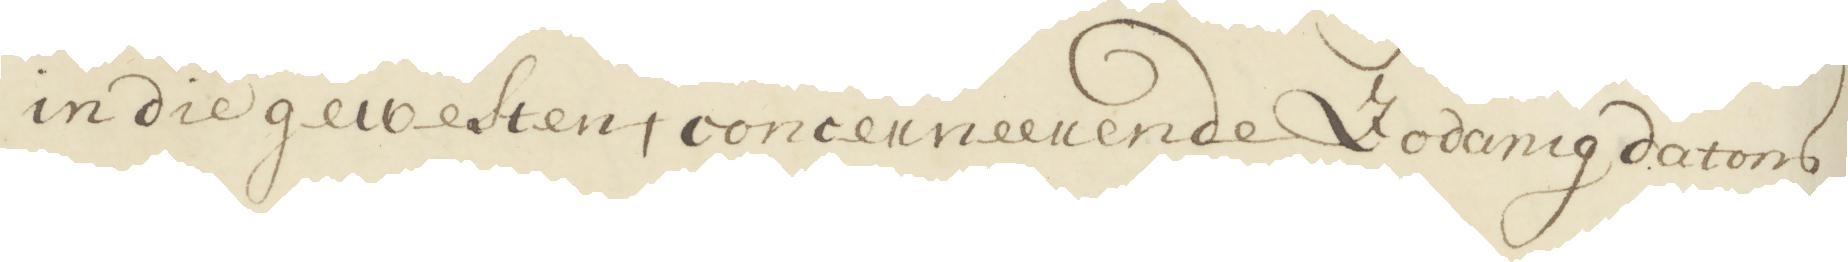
in die gewesten, concerneerende Zodanig dat ons
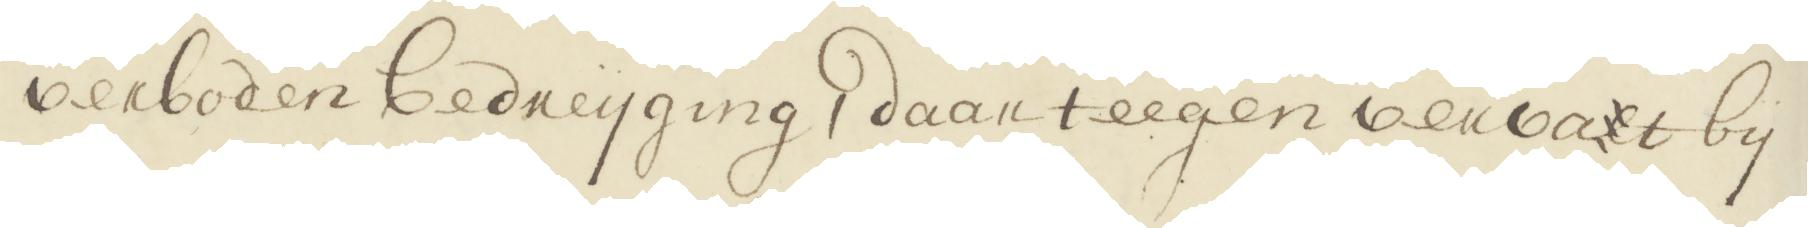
verboden bedreijging, daar teegen vervalt bij
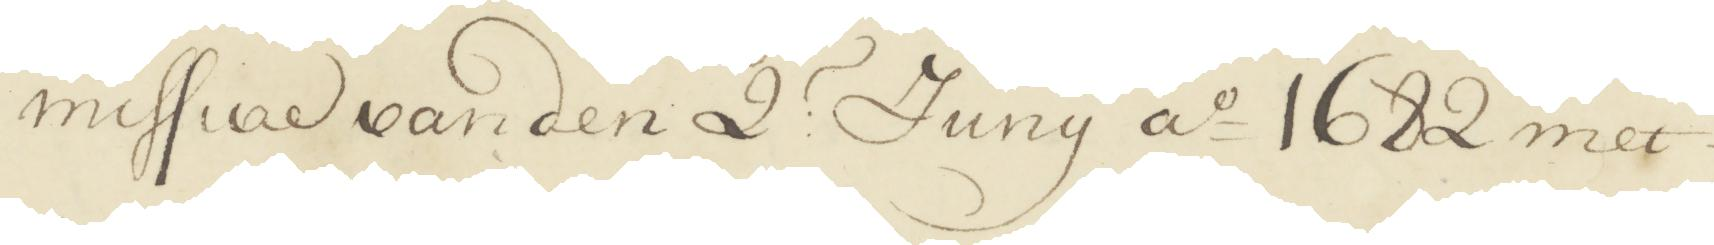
missive van den 2:' Junij a=o 1682 met
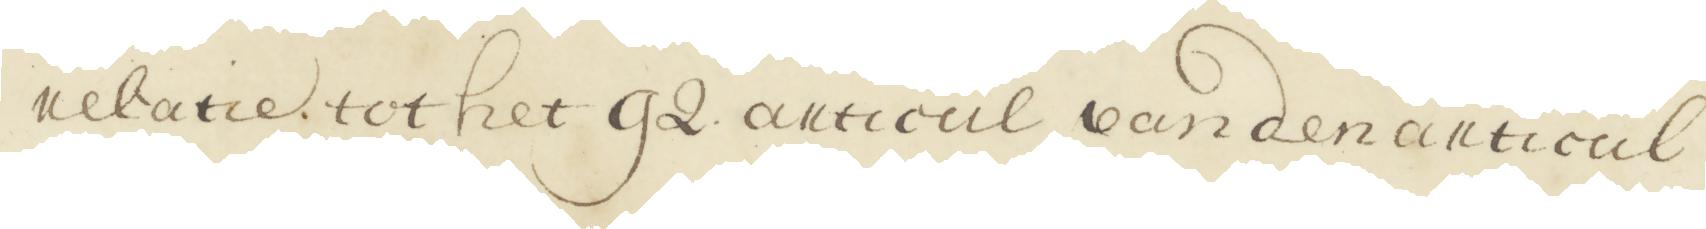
rebatie tot het 92. articul van den articul
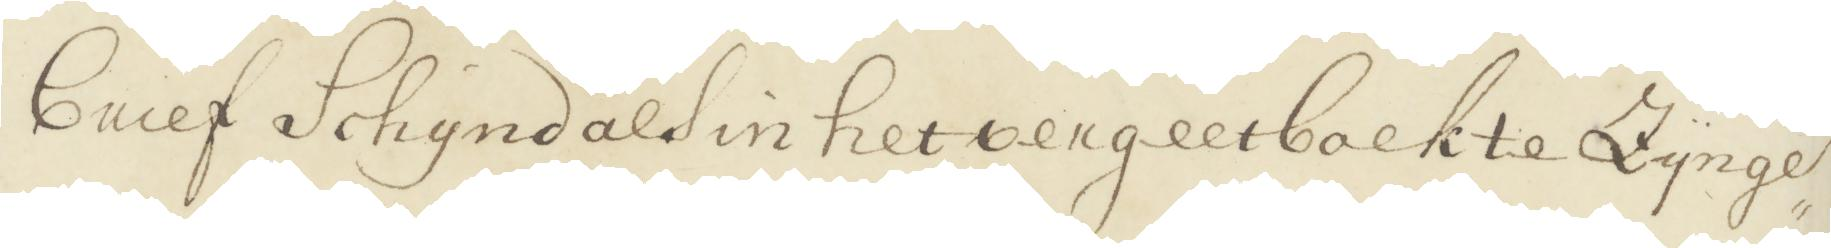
brief Schijnd als in het vergeetboekte Zijn ge„
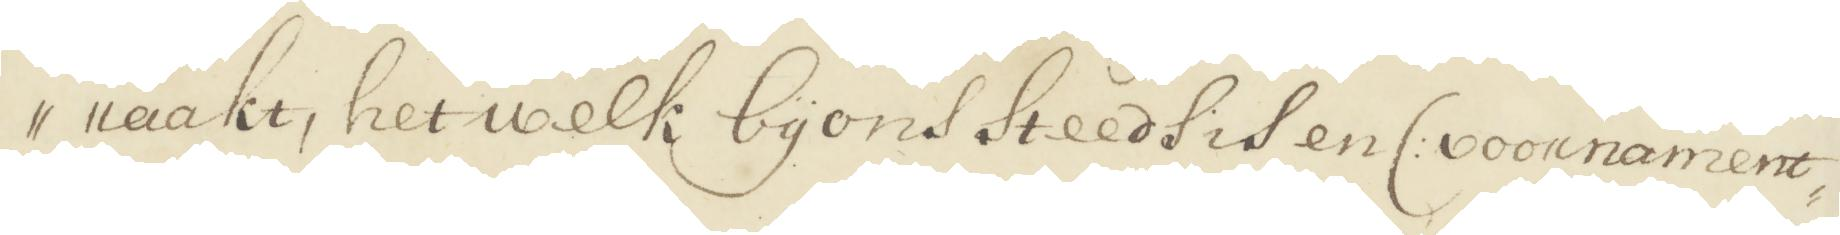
„raakt, het welk bij ons steeds is en (:voornament„
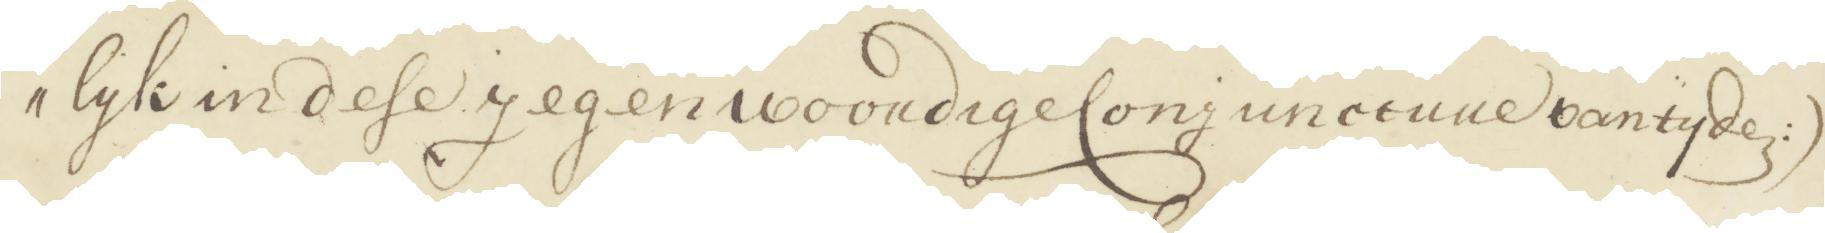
„lijk in dese jegenwoordige Conjuncture van tijden:)
